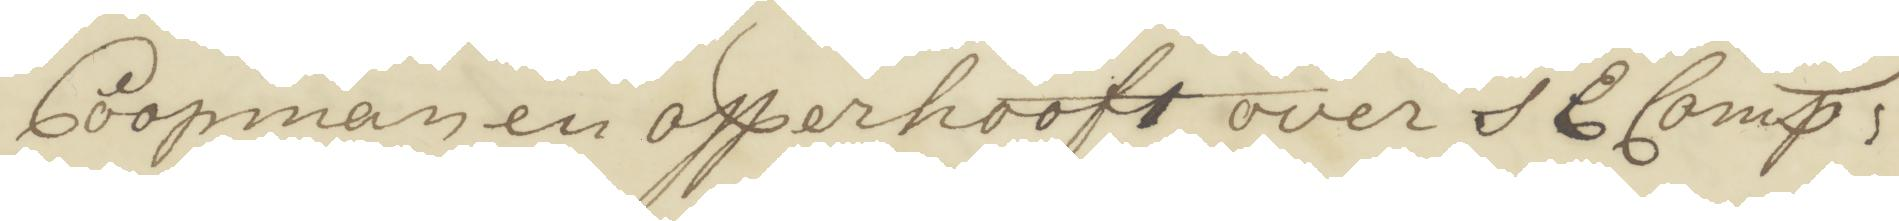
Coopman en opperhooft over ’s E Comps
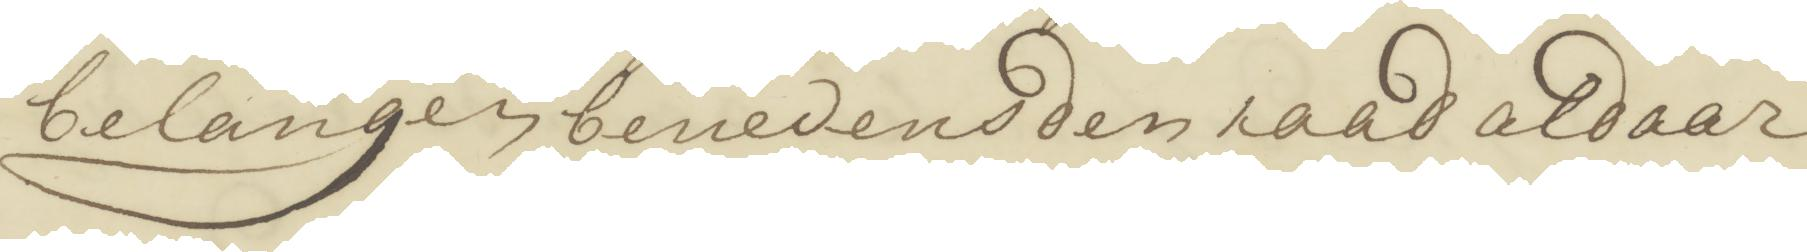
belangen benedens den raad aldaar
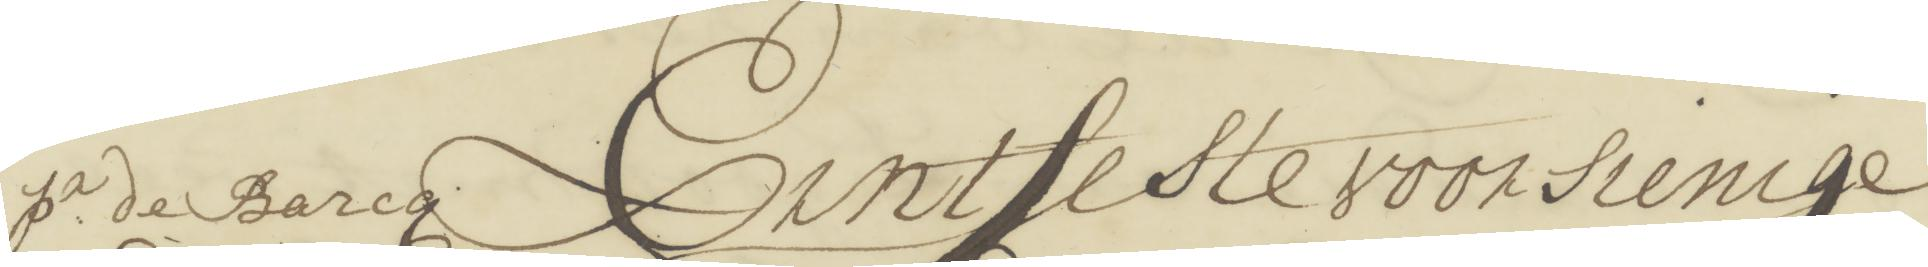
p:r de Barcq Erntfeste voorsienige
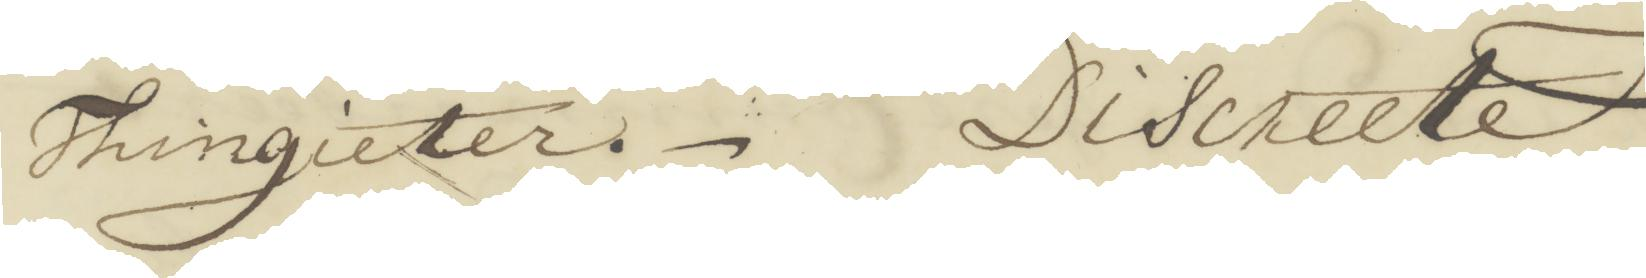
Thingieter. — Discreete
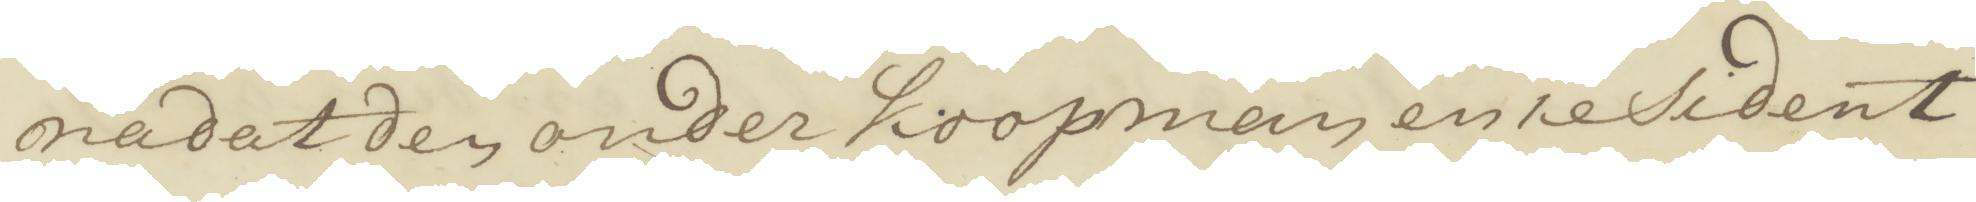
nadat den onder koopman en resident
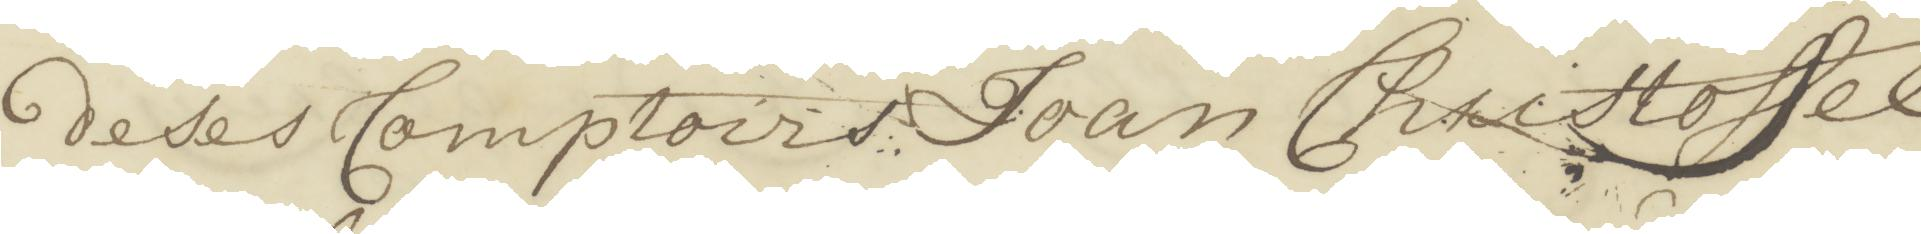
deses Comptoirs Ioan Christoffel
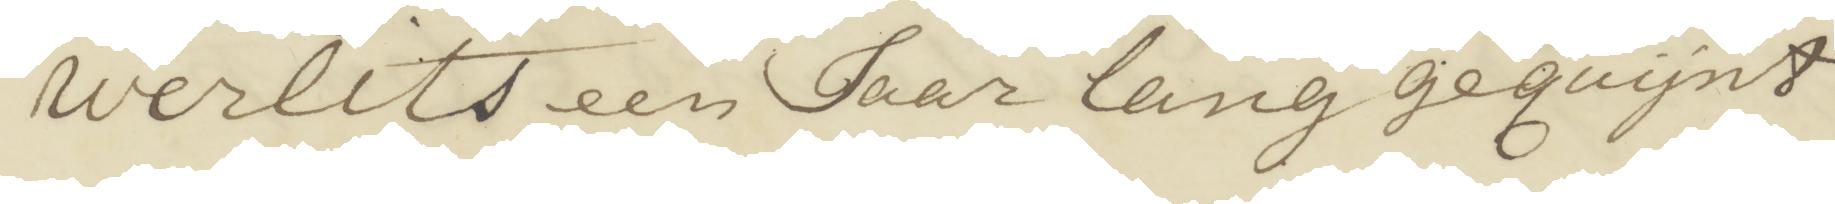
werlits een Iaar lang gequijnt
